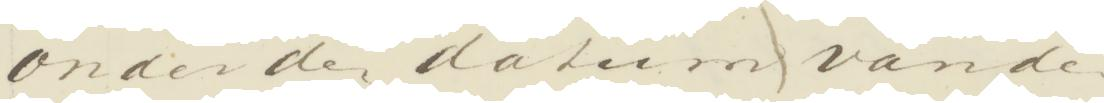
onder den datum van den
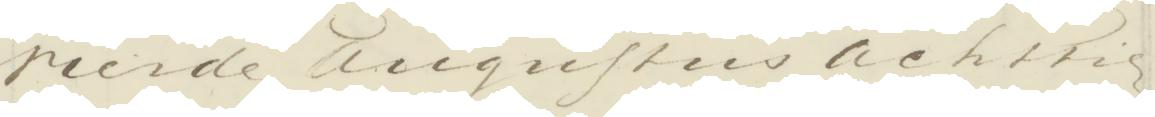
vierden Augustus achttien
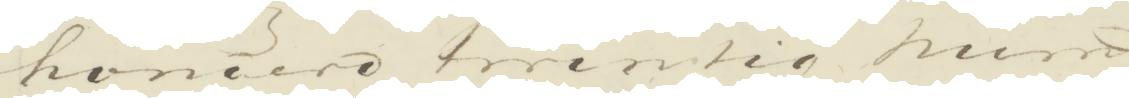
honderd twintig num
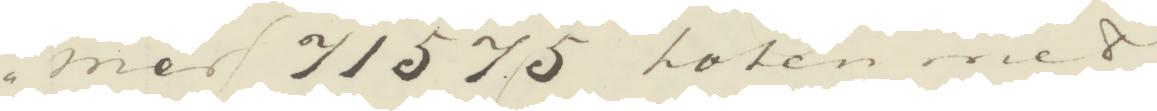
„mer 71575 toten met
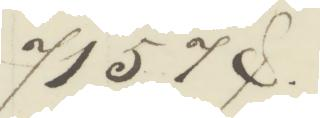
71578.
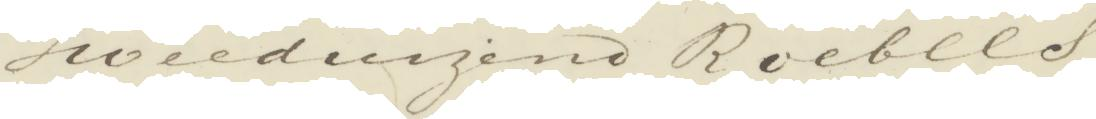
Tweeduizend Roebels
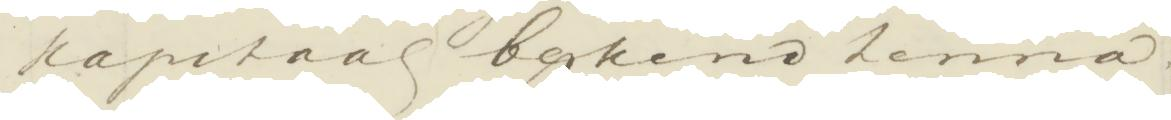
kapitaal bekend tenna
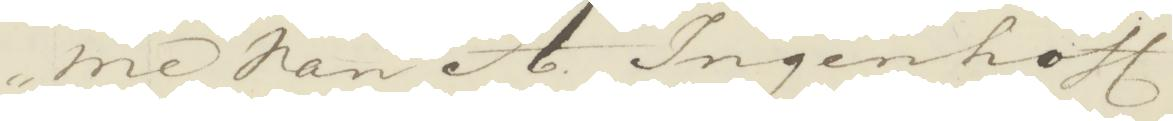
„me Van A. Ingenhoff
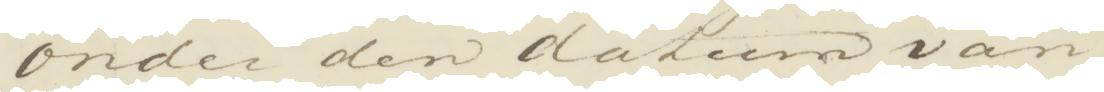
onder den datum van
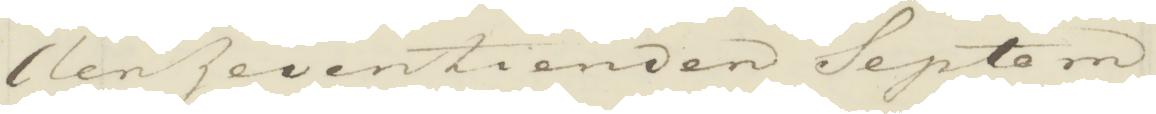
den Zeventienden Septem
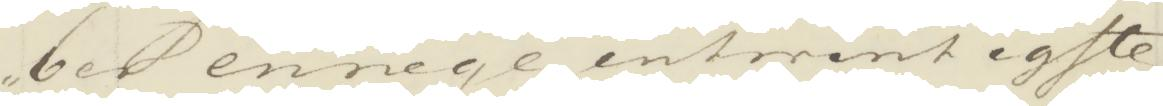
„ber en negen entwintigsten
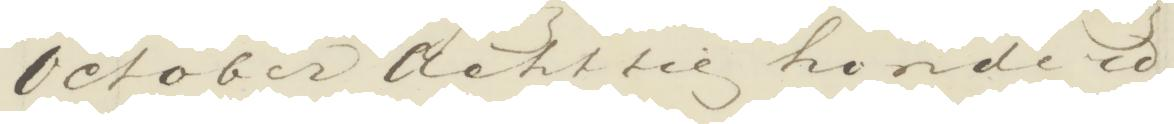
October Achttien honderd
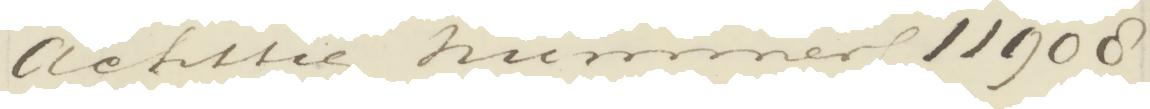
Achttien Nummers 11908
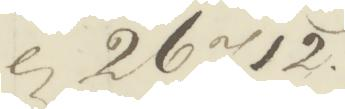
en 26712.
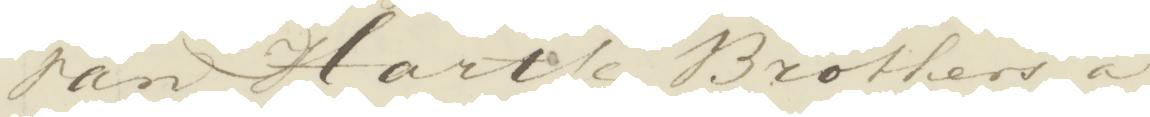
Van Hartsen Brothers à
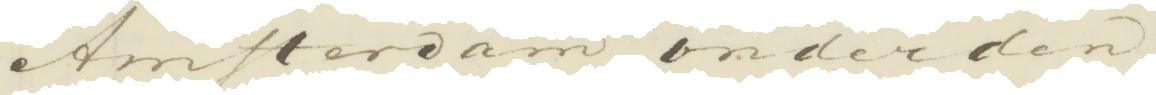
Amsterdam, onder den
